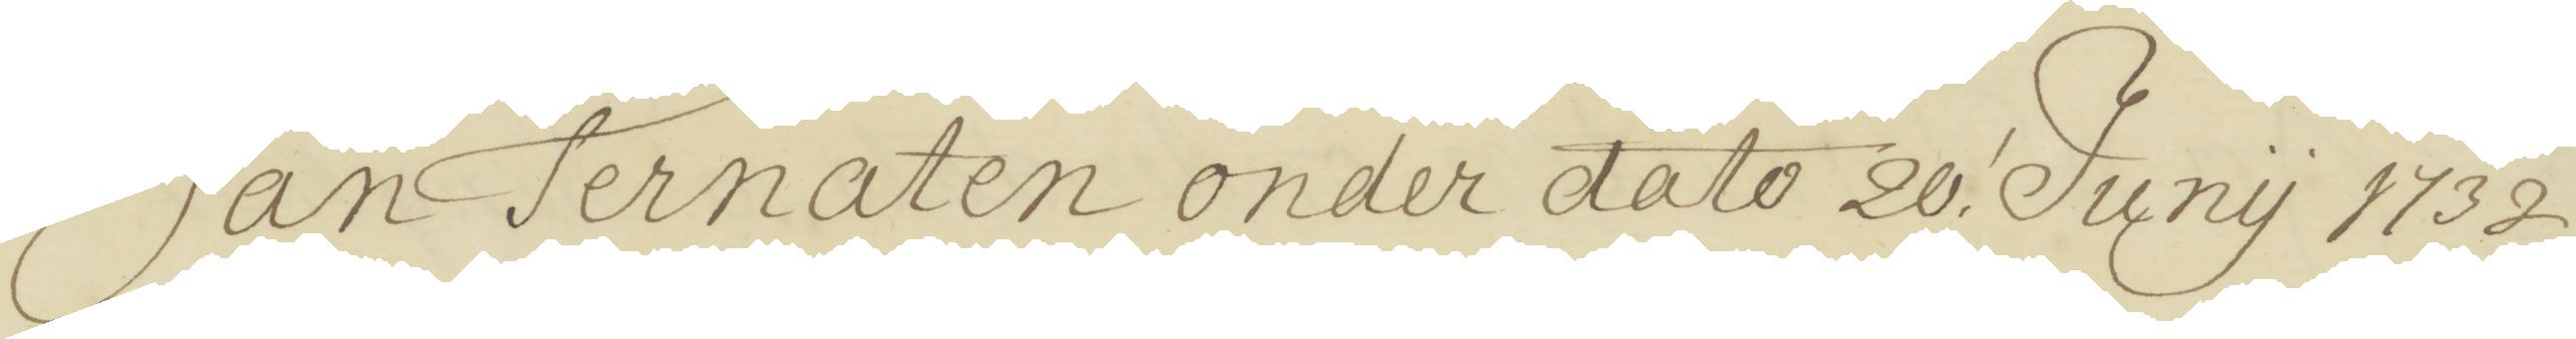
Van Ternaten onder dato 20:' Iunij 1732
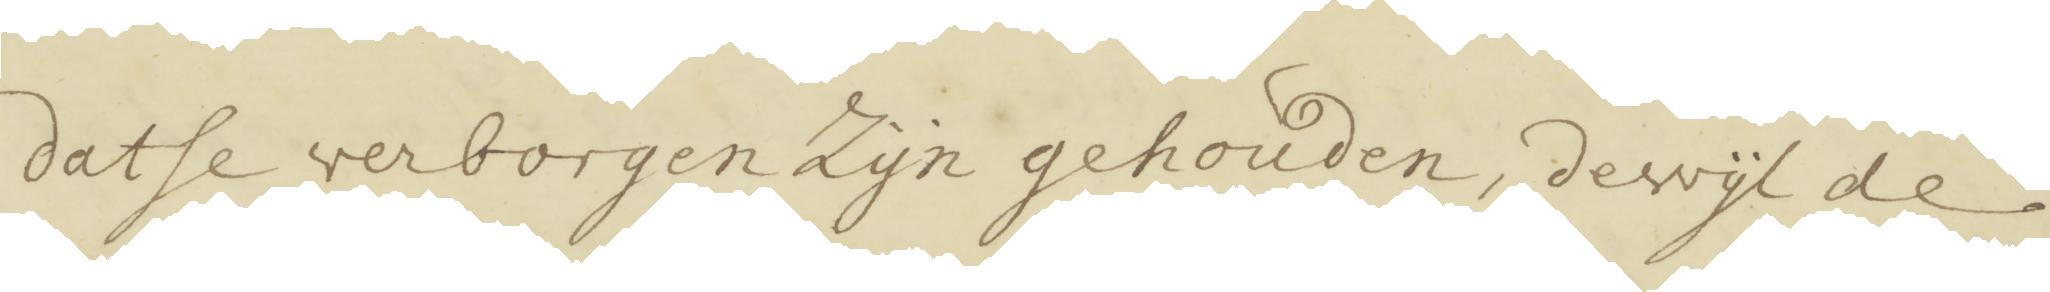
dat se verborgen Zijn gehouden, dewijl de
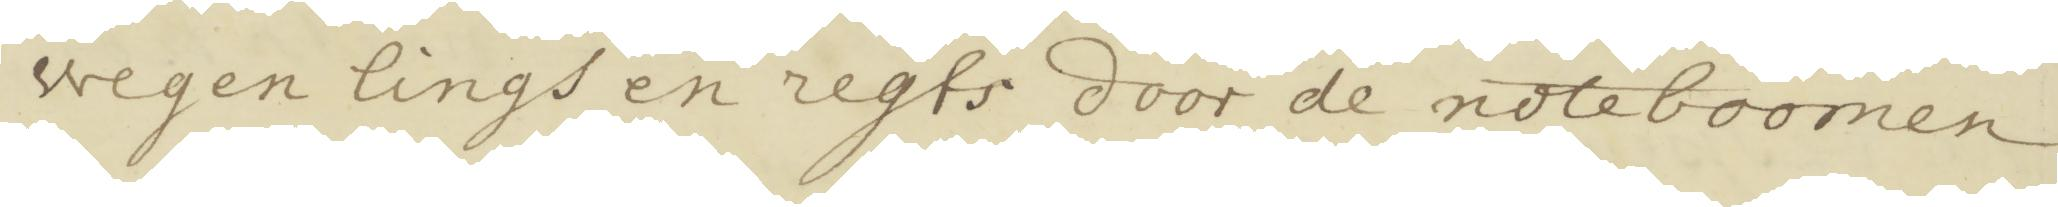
wegen lings en regts door de noteboomen
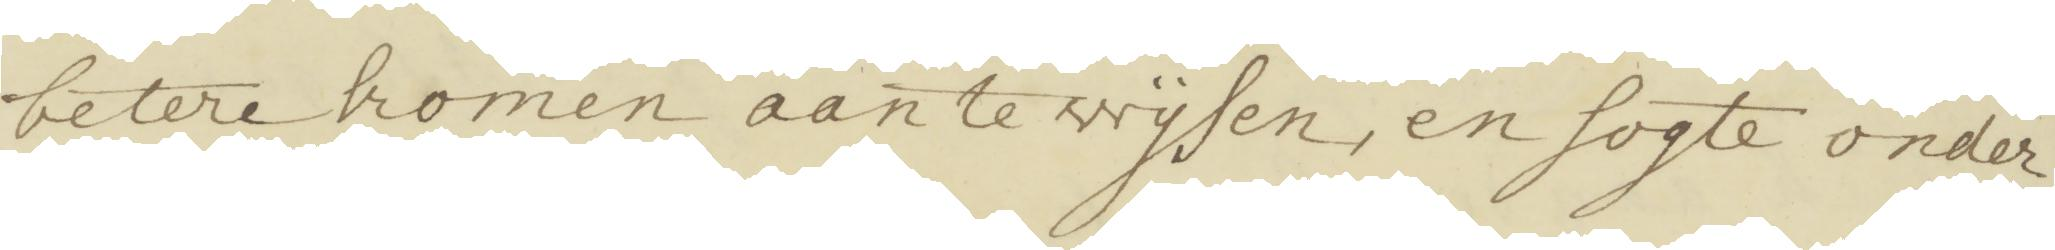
betere komen aan te wijsen, en sogte onder
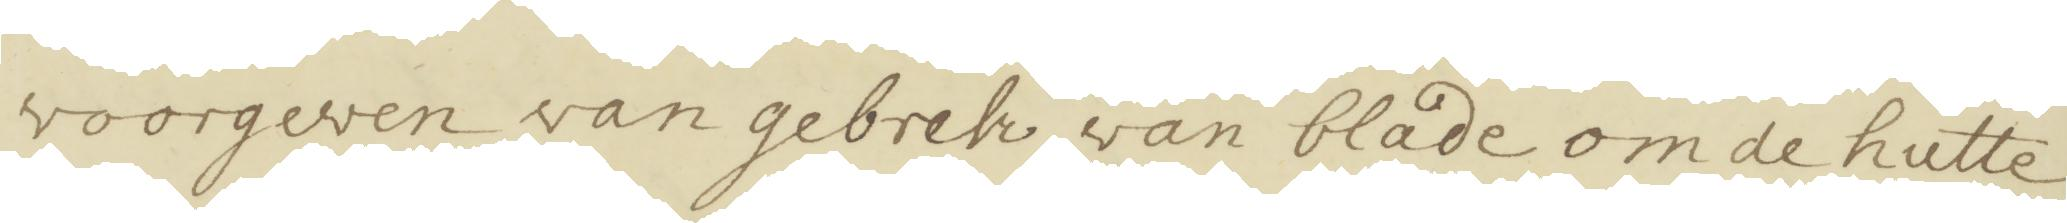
voorgeven van gebrek van blade om de hutte
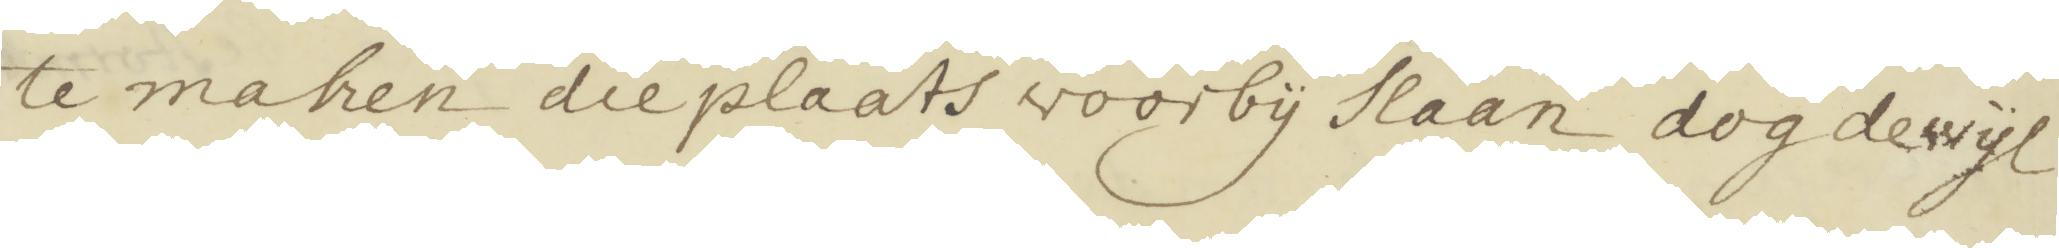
te maken die plaats voorbij slaan dog dewijl
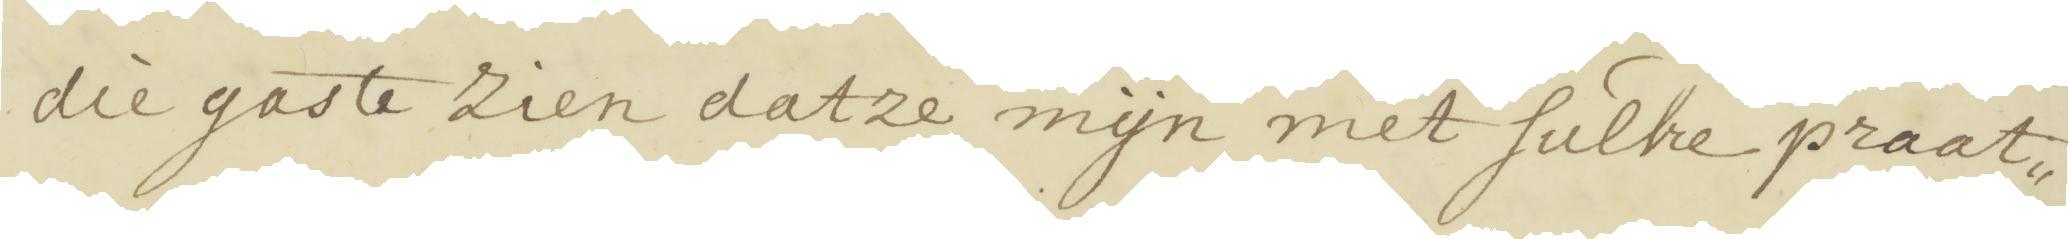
die gaste zien dat ze mijn met sulke praat„
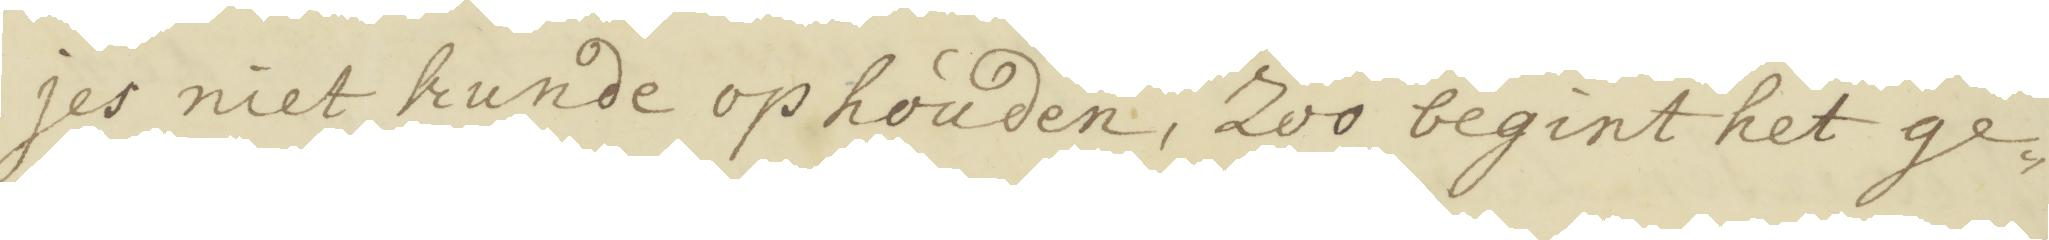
jes niet kunde op houden, Zoo begint het ge„
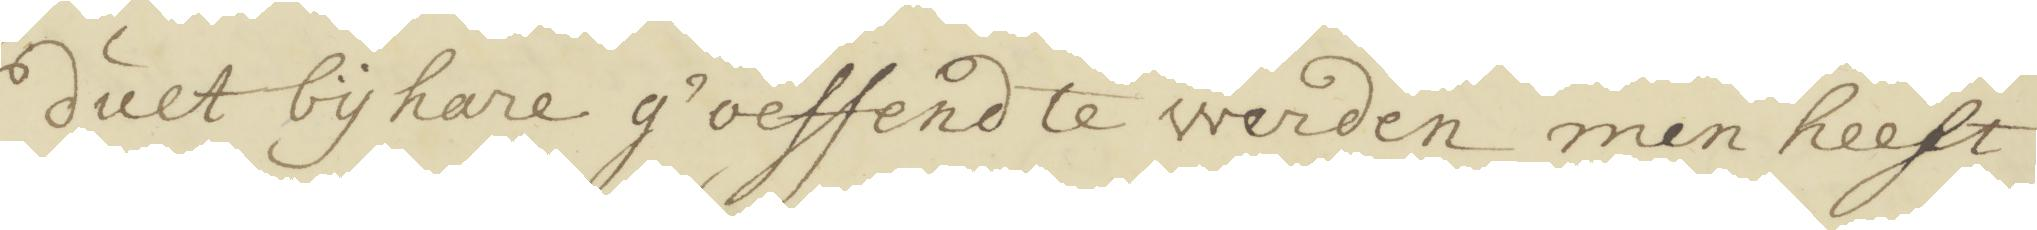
dult bij hare g’oeffend te werden men heeft
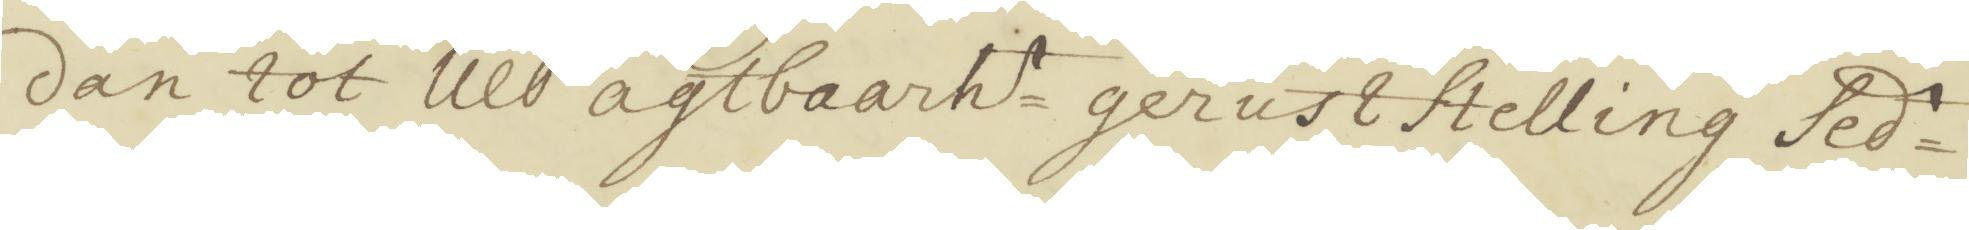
dan tot ued agtbaarh=t geruststelling Sed=t
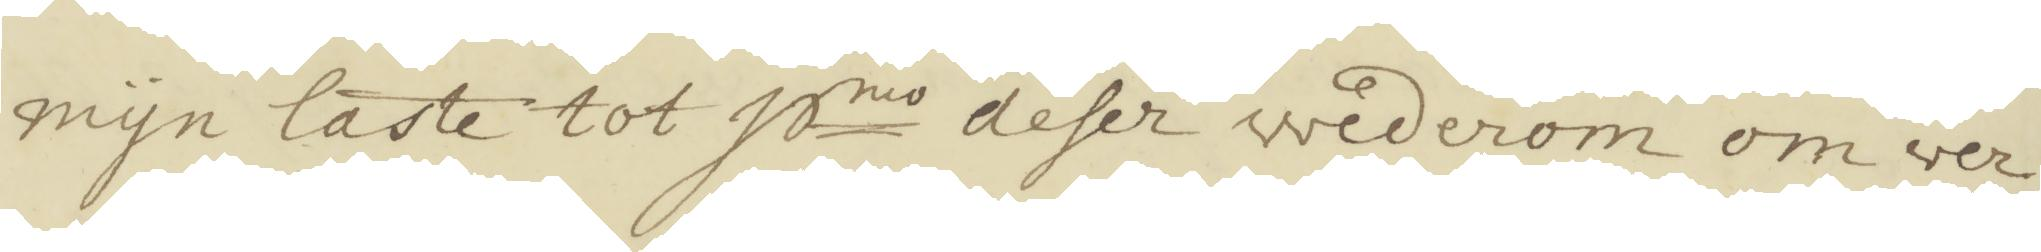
mijn laste tot p=mo deser wederom om ver
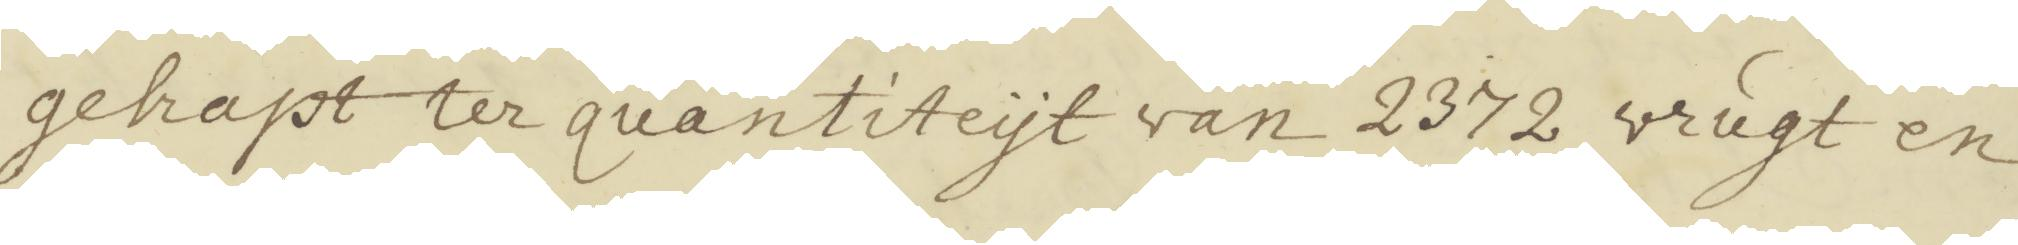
gekapt ter quantiteijt van 2372 vrugt en
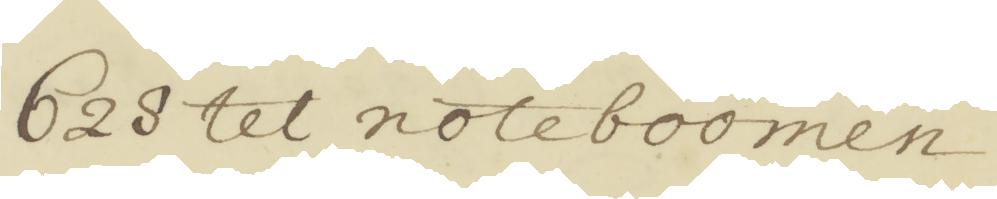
628 tel noteboomen
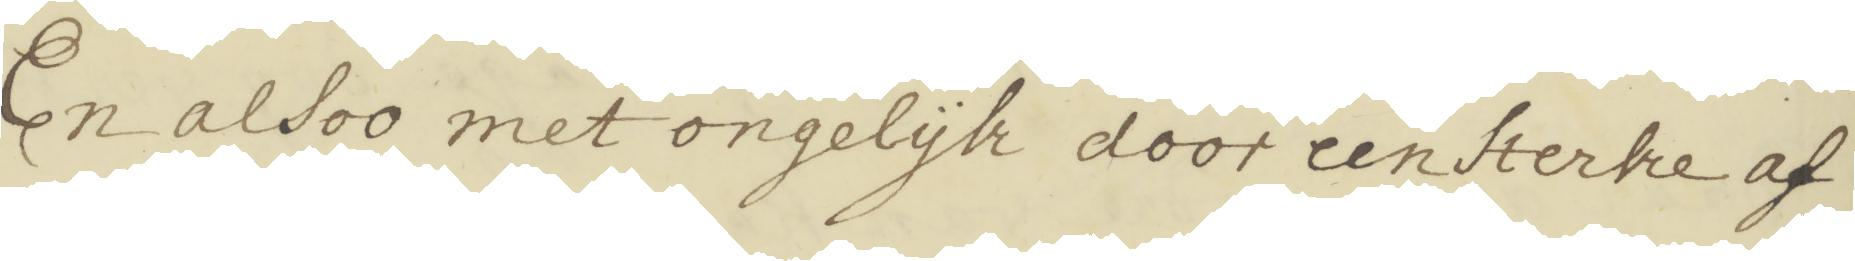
En alsoo met ongelijk door een sterke af
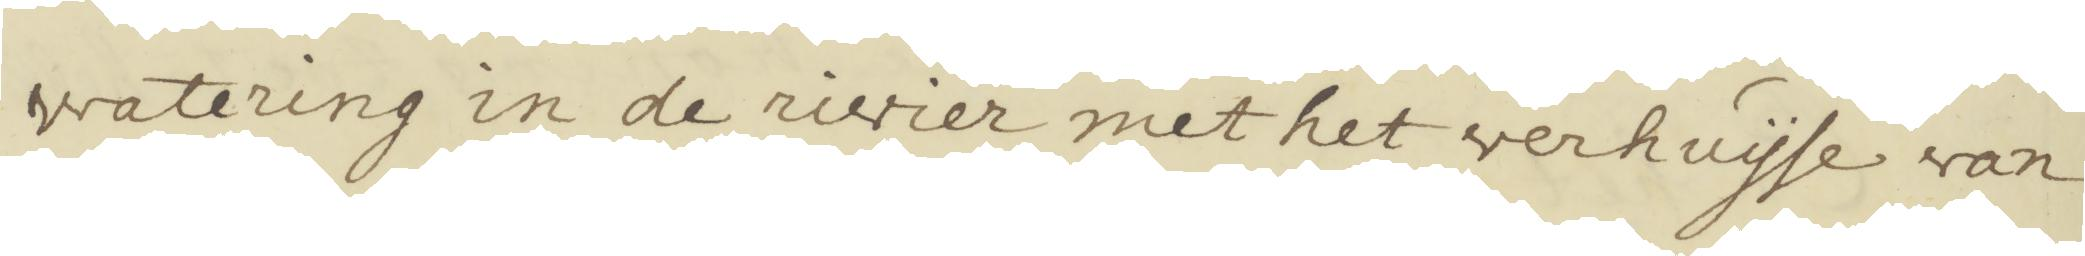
watering in de rivier met het verhuijse van
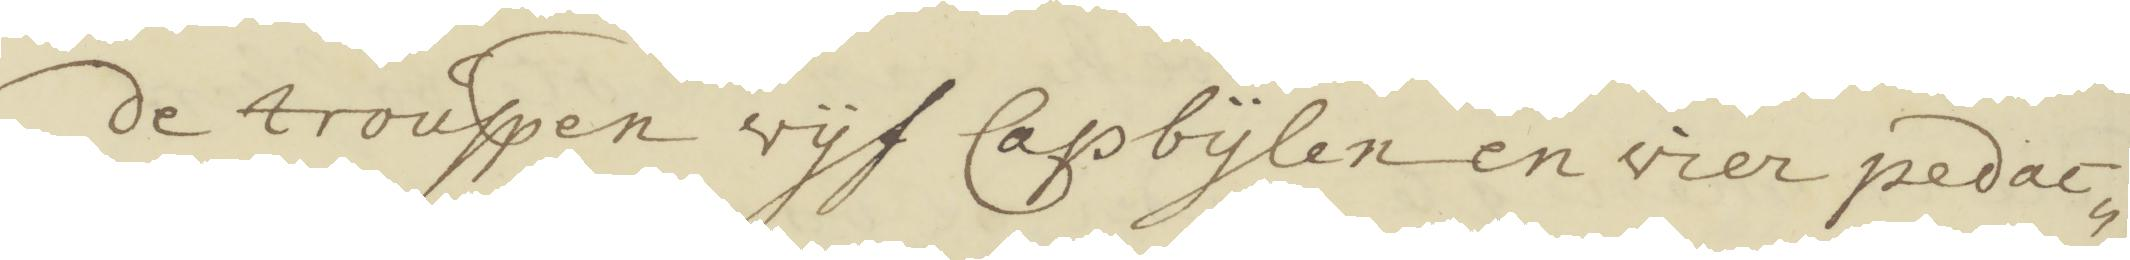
de trouppen vijf Capbijlen en vier pedac„
